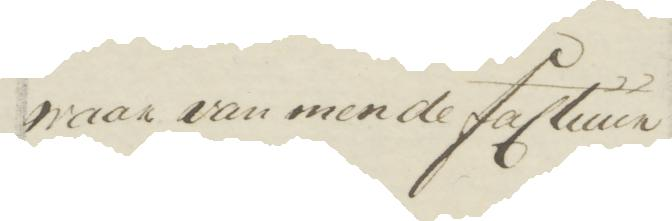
waar van men de factuur
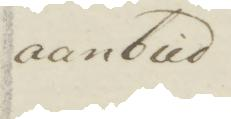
aanbied
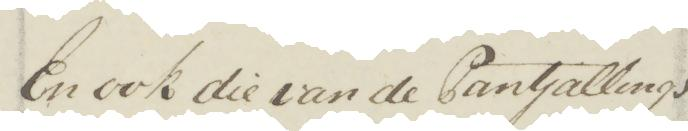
En ook die van de Pantjallings
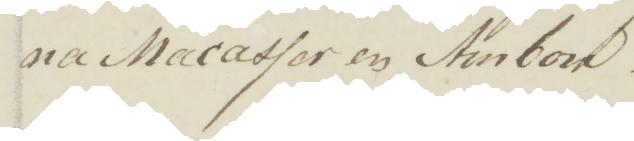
na Macasser en Ambon
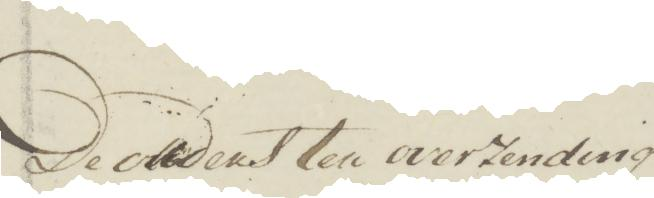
De orders ten overzending
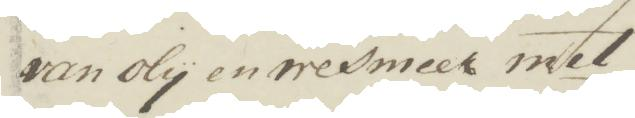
van olij en wesmeer met
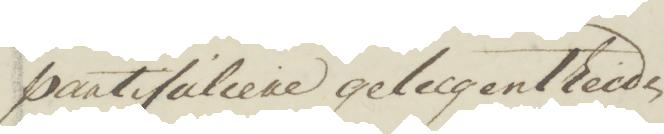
particuliere geleegentheeden
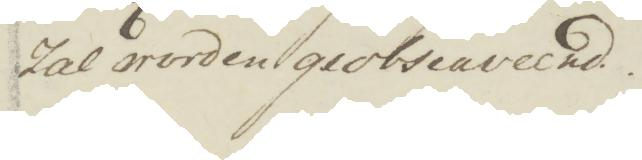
zal worden geobserveerd.
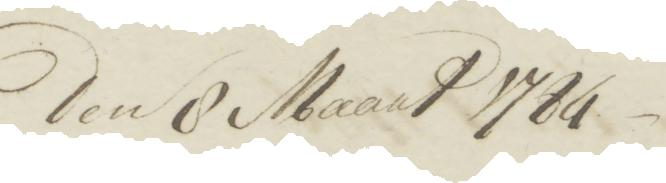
den 8 Maart 1784. -
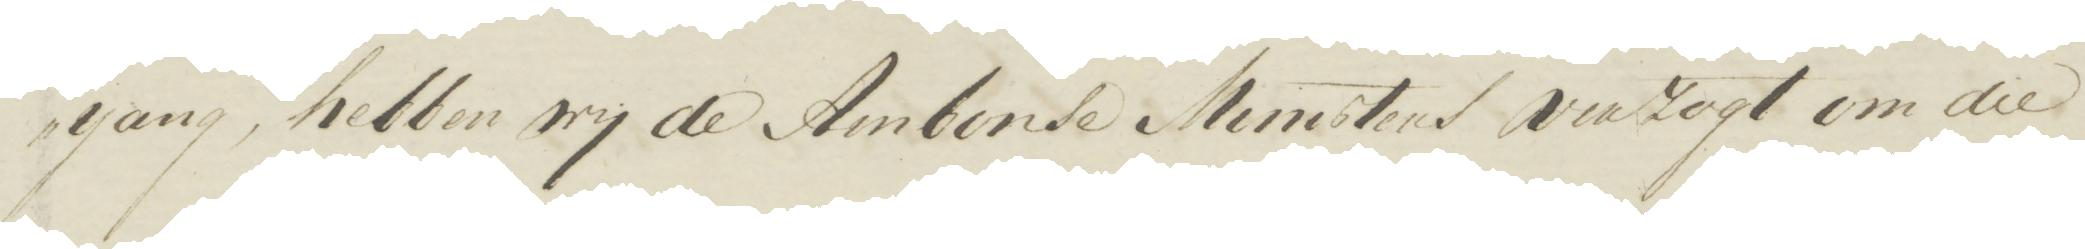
„yang, hebben wij de Ambonse Minsters verzogt om die
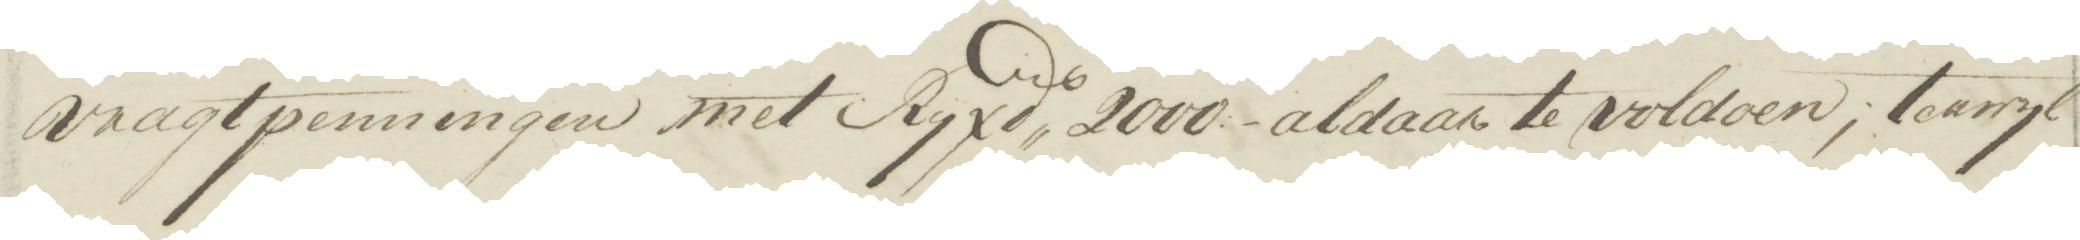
vragtpenningen met Rijxd„rs 2000:- aldaar te voldoen; terwyl
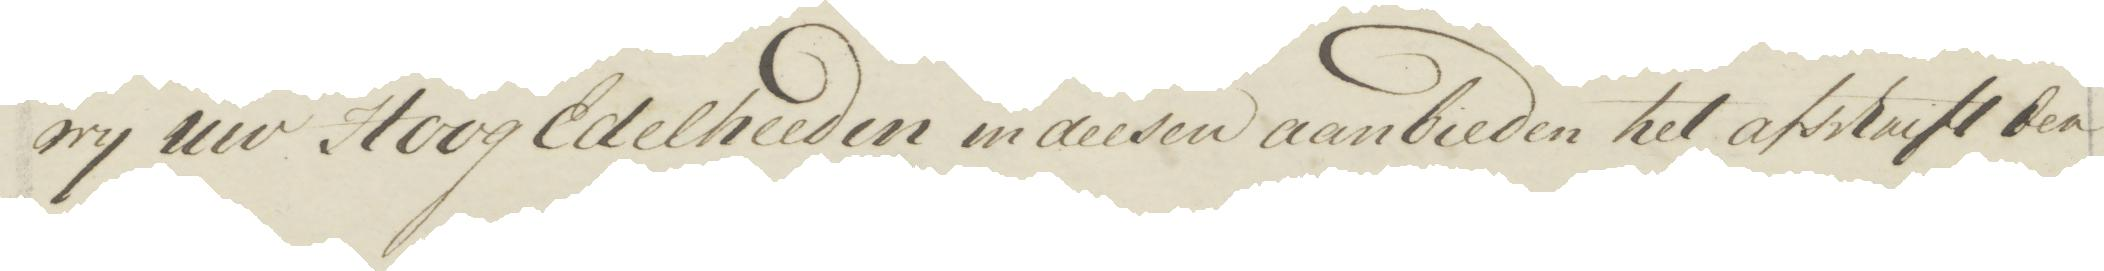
wy uw Hoog Edelheeden in deesen aanbieden het afschrift der
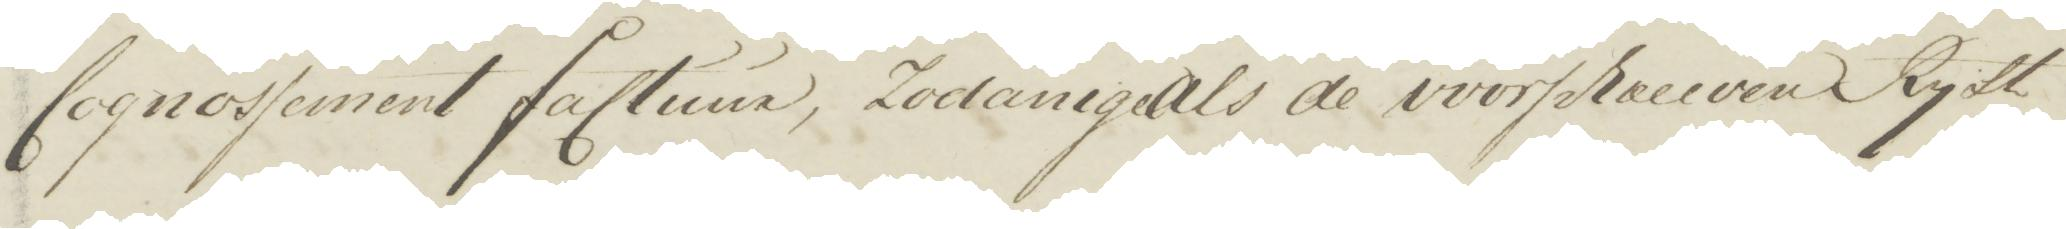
Cognossement factuur, zodanige als de voorschreeven Rijst
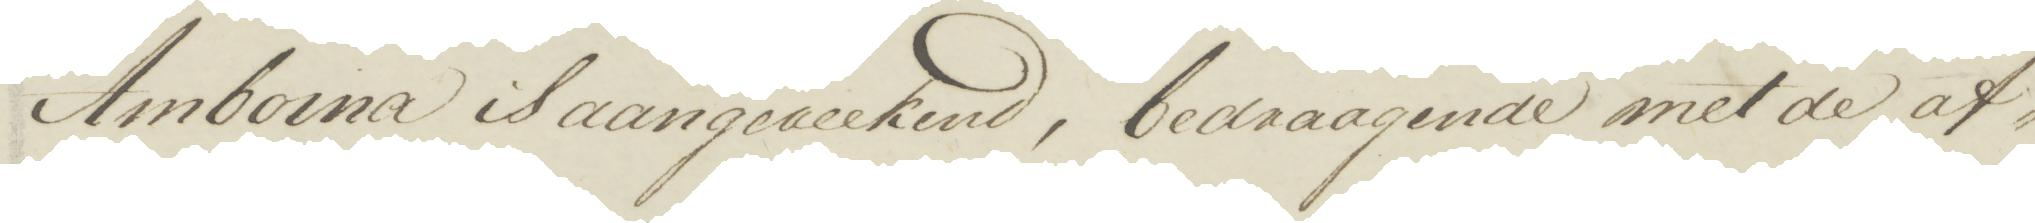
Amboina is aangereekend, bedraagende met de af„
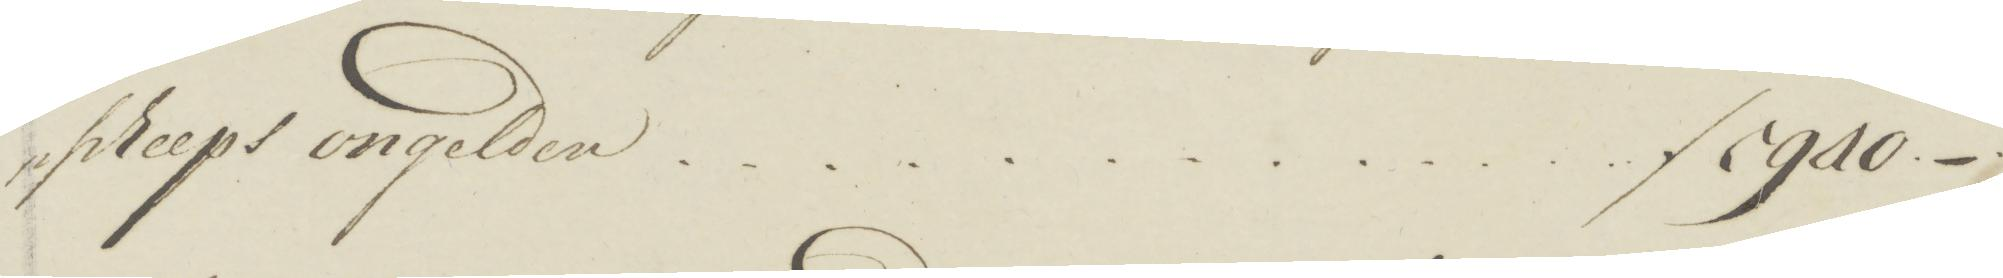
„scheeps ongelden - - - - - - - - . . - . . .. ƒ5940. —
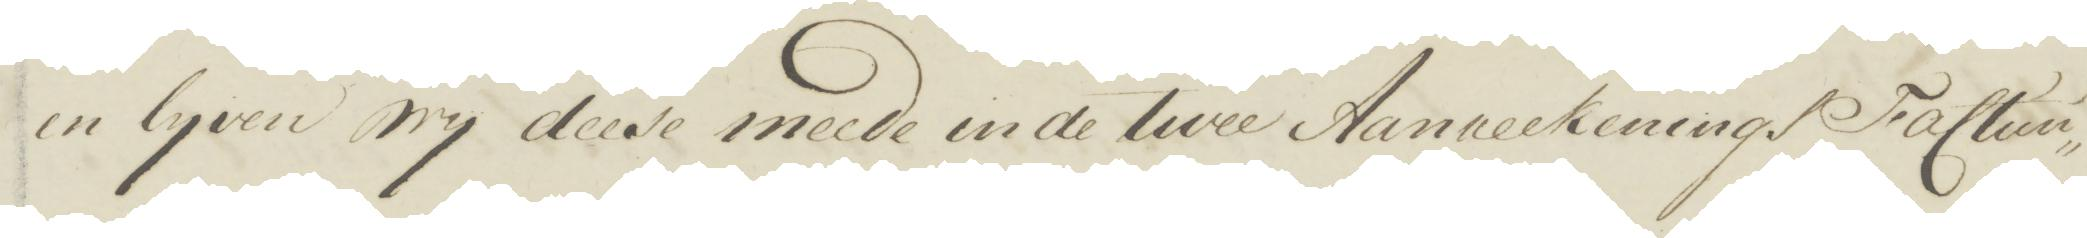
en lyven wij deese meede in de twee Aanreekenings Factuu„
